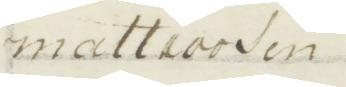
mattroosen
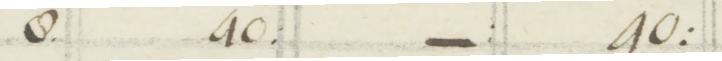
8. 40: —: 40:
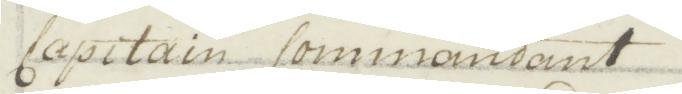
Capitain Commandant
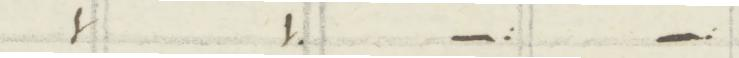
1 1. —: —:
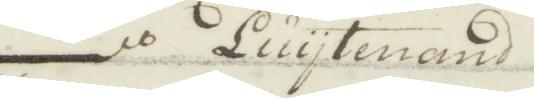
_o Luijtenand
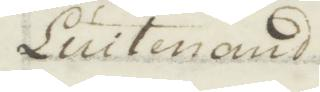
Luitenand
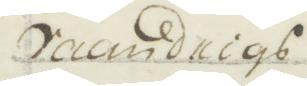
vaandrigs
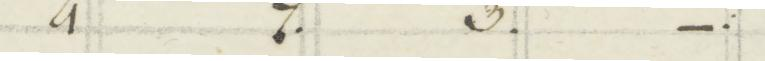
4 7. 3. —.
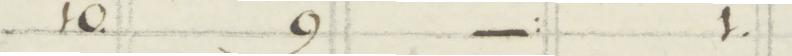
10. 9 —: 1.
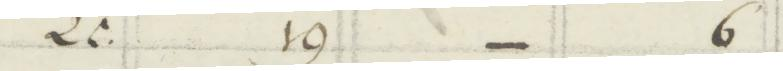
25. 19 — 6
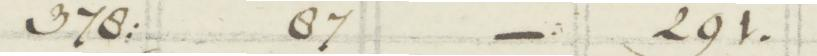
378: 87 —. 291.
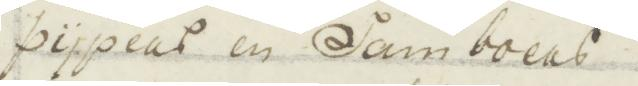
pijpers en Jamboers
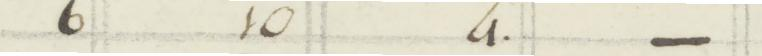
6 10 4. —
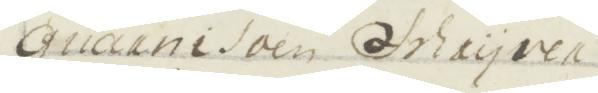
guarnisoen Schrijver
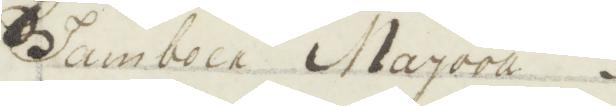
Jamboer Majoor
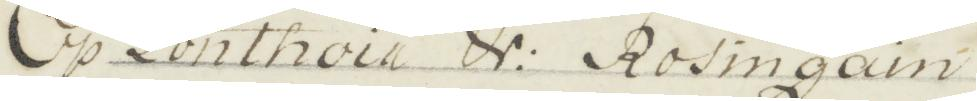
Op Lonthoir &: Rosingain
